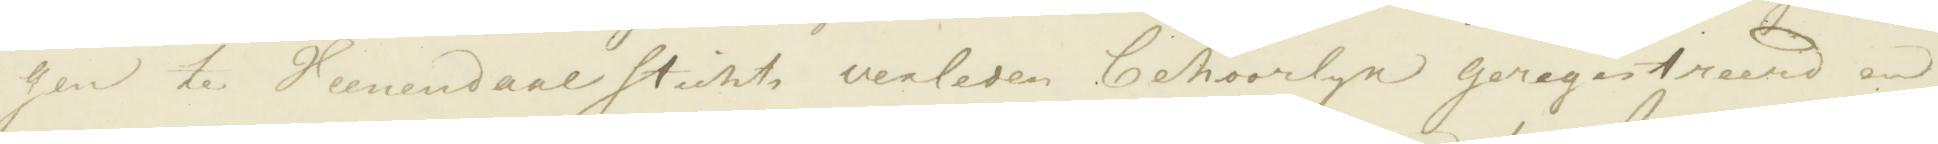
gen te Veenendaal stichts verleden behoorlyk geregistreerd en
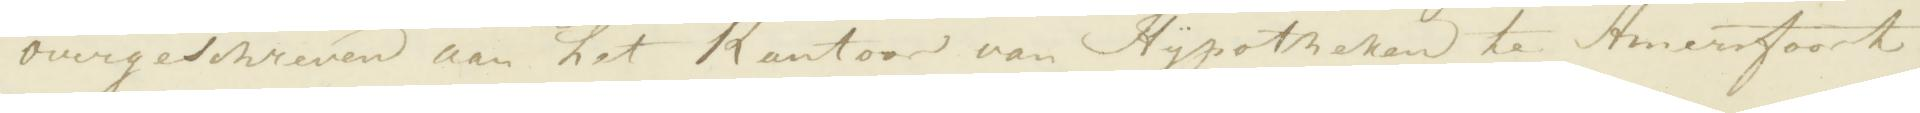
overgeschreven aan het Kantoor van Hijpotheken te Amersfoort
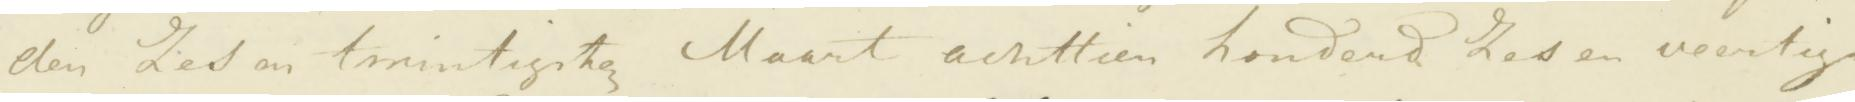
den Zes en twintigsten Maart achttien honderd Zes en veertig
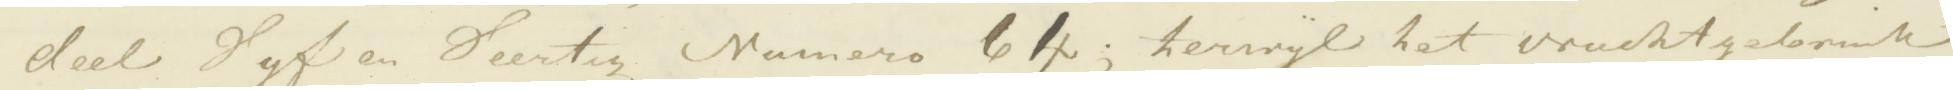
deel Vyf en Veertig Numero 64; terwijl het vruchtgebruik
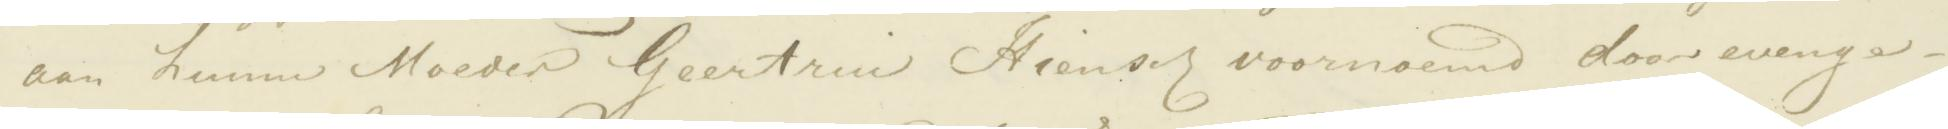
aan hunne Moeder Geertrui Hiensch voornoemd door evenge-
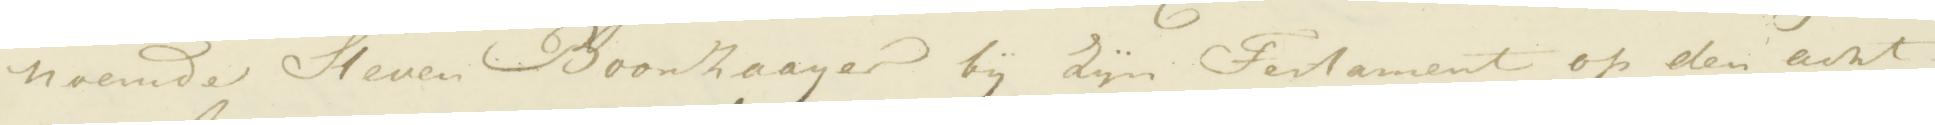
noemde Steven Boonzaayer bij zijn Testament op den acht
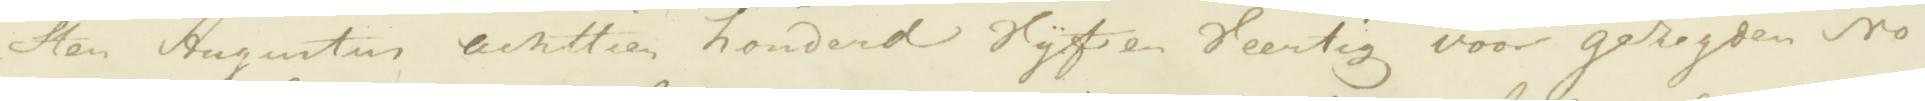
sten Augustus achttien honderd Vijf en Veertig voor gezegden No
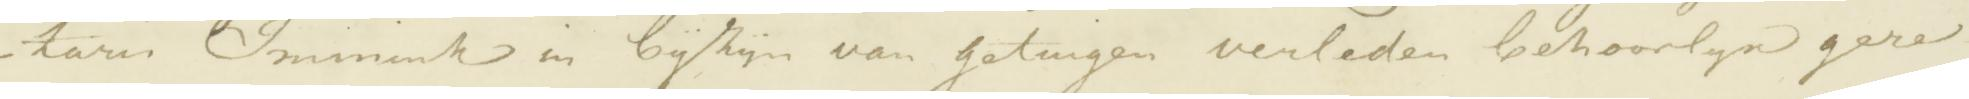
taris Immink in bijzijn van getuigen verleden behoorlyk gere
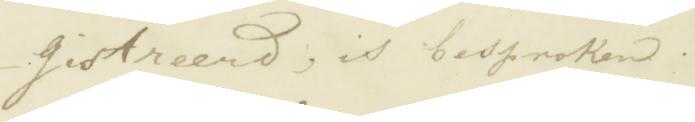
gistreerd, is besproken.
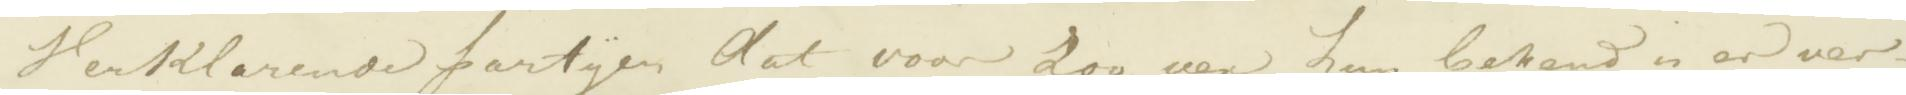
Verklarende partijen dat voor zoo ver hun bekend is er ver
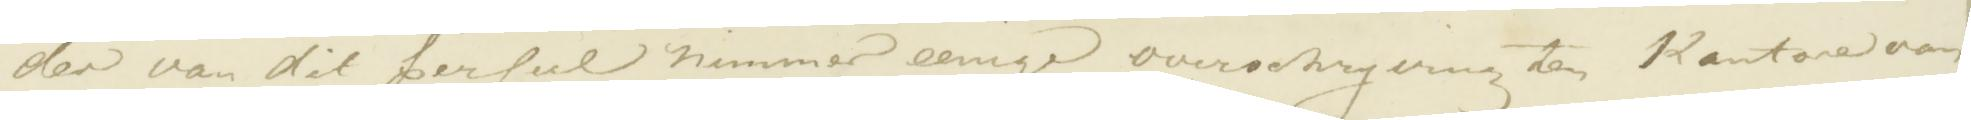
der van dit perceel nimmer eenige overschryving ten Kantore van
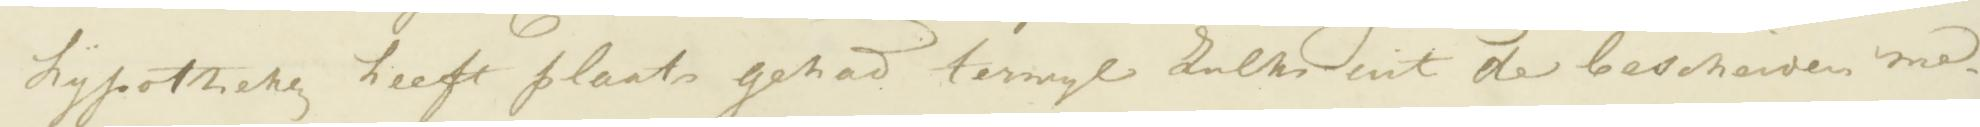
hijpotheken heeft plaats gehad terwyl zulks uit de bescheiden me
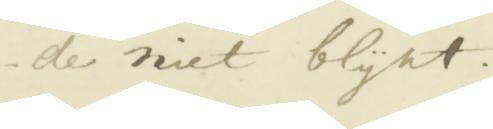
-de niet blijkt.
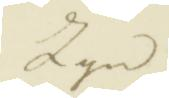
Zyn
